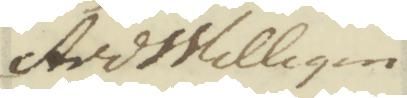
A v d Willigen
